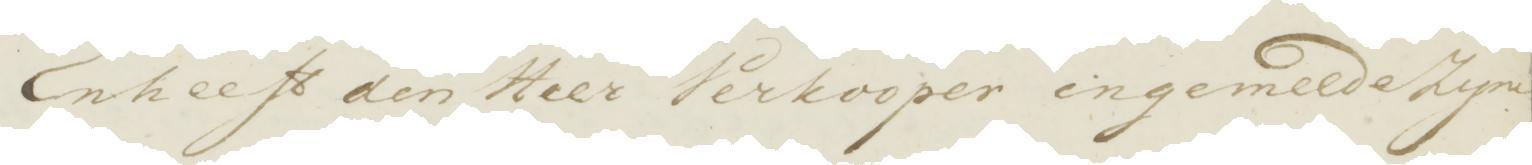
En heeft den Heer Verkooper ingemelde zyne
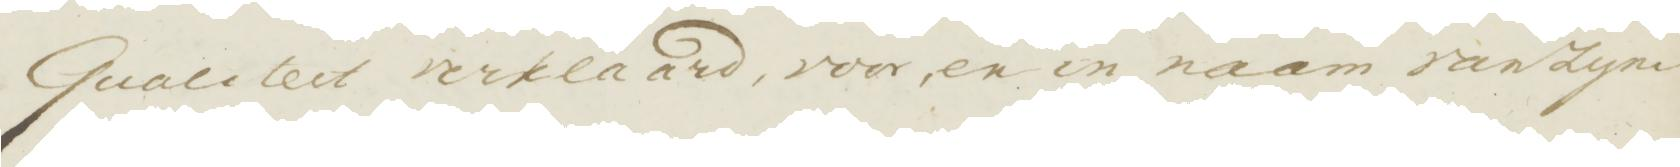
qualiteit verklaard, voor, en in naam van zyne
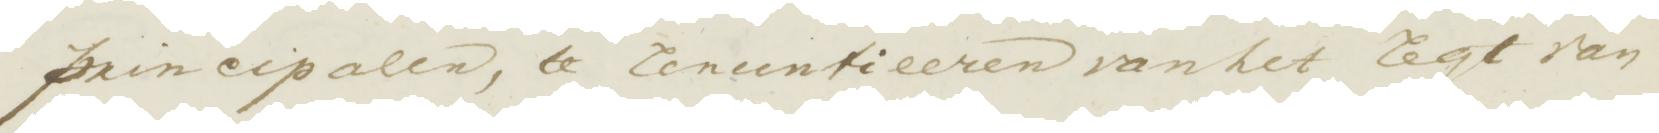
principalen, te renuntieeren van het regt van
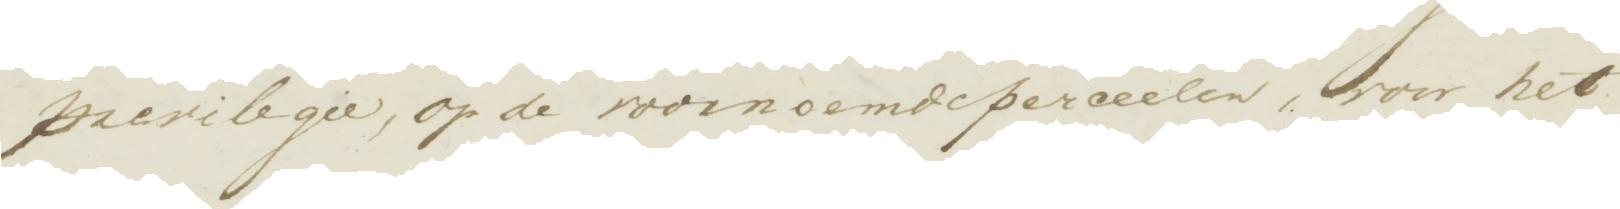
previlegie, op de voornoemde perceelen, voor het
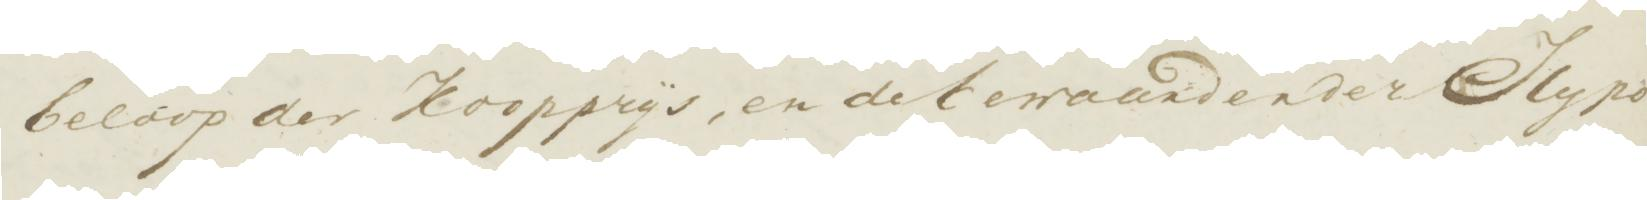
beloop der koopprijs, en de te waarden der Hypo
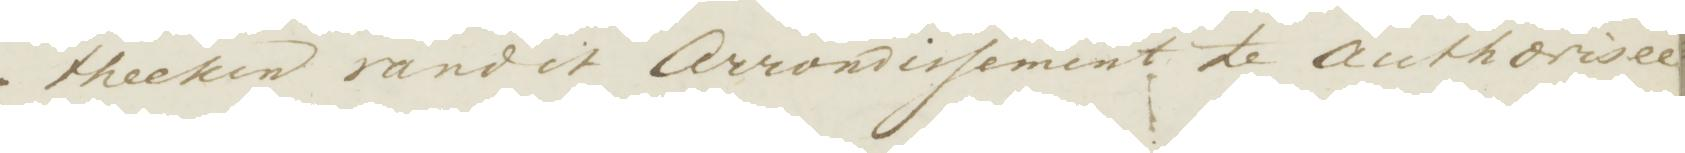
theeken van dit Arrondissement te Authorisee
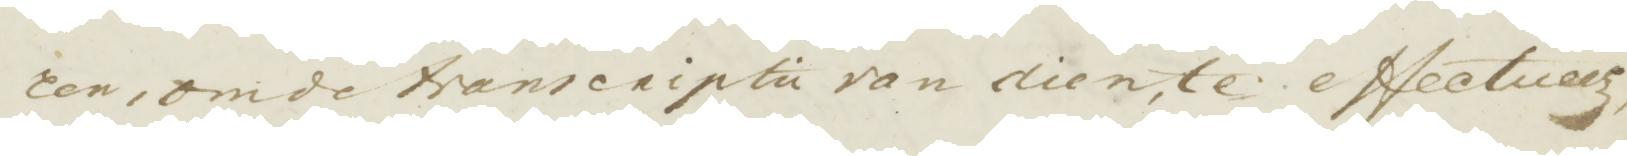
ren, om de transcriptie van dien, te effectueren,
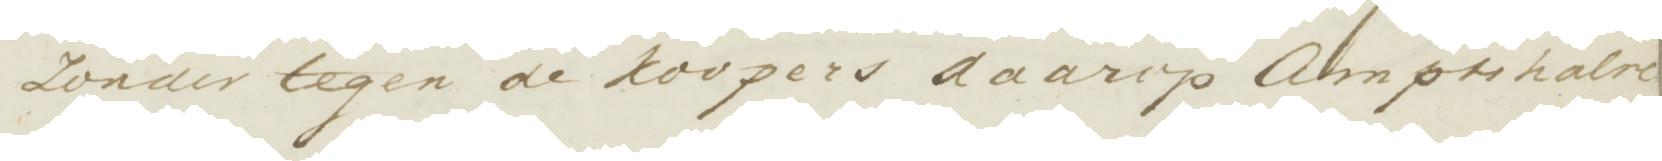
zonder tegen de koopers daarop Amptshalve
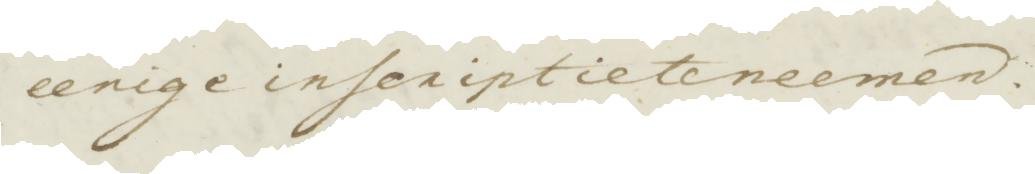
eenige inscriptie te neemen.
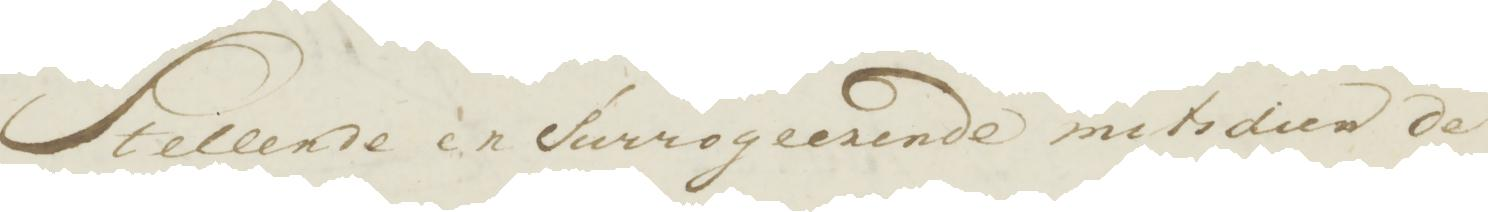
Stellende en Surrogeerende mitsdien de
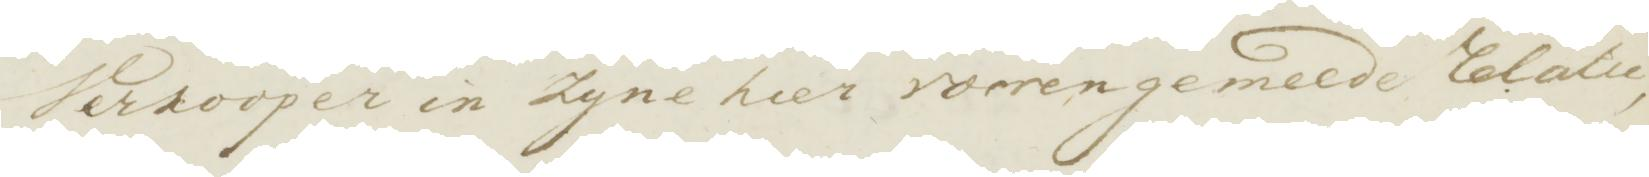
Verkooper in zyne hier vooren gemelde relatie,
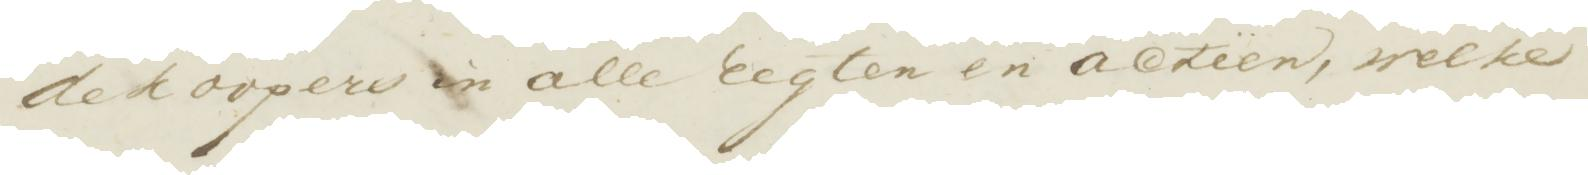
de koopers in alle regten en actiën, welke
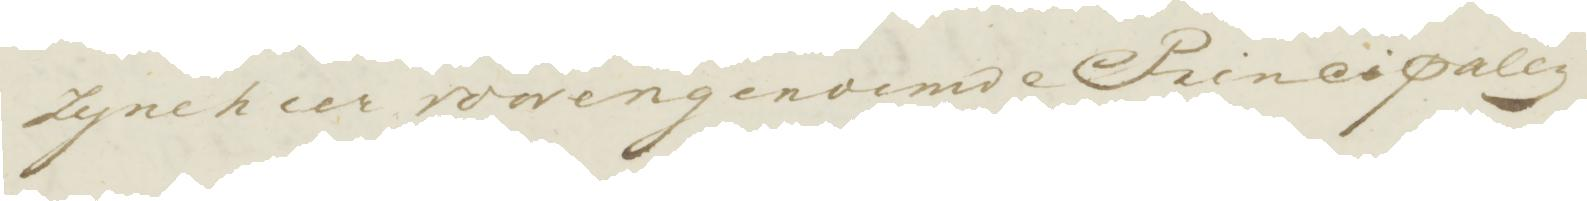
zyne heer voorengenoemde Principalen
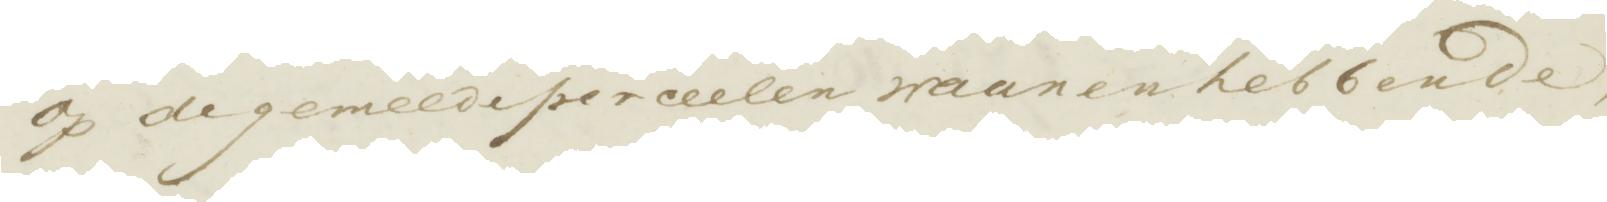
op de gemelde perceelen waaren hebbende,
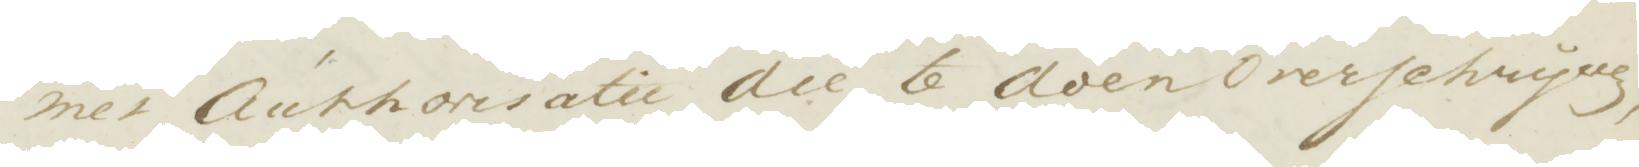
met authorisatie die te doen overschrijven,
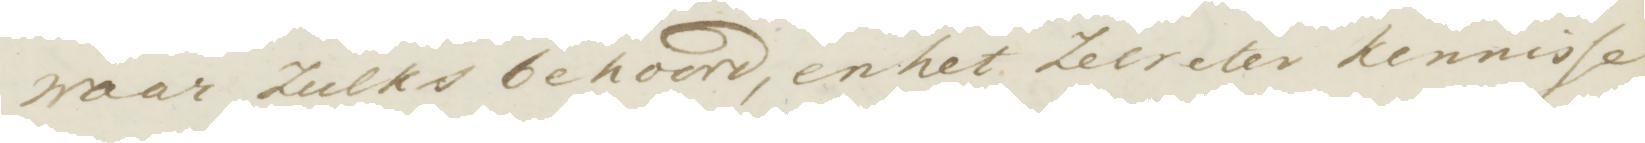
waar zulks behoord, en het zelve ter kennisse
